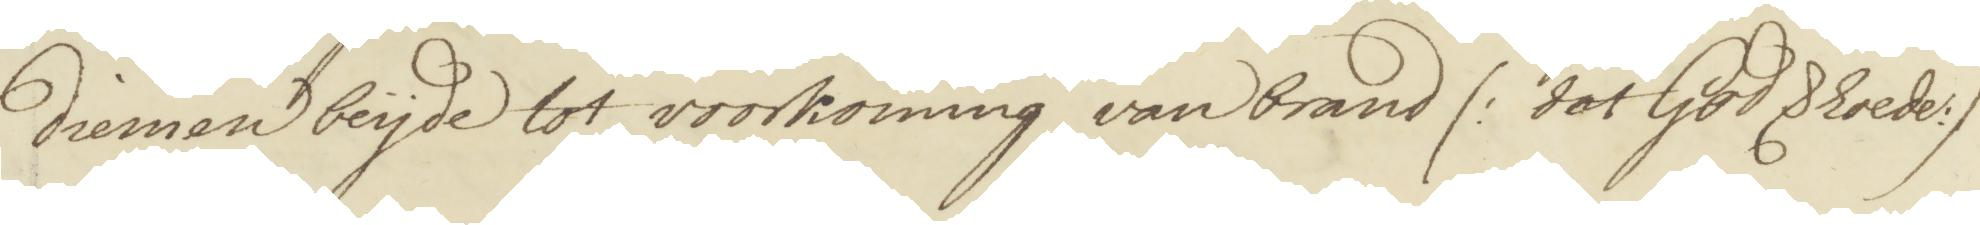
diemen beijde tot voorkoming van brand /: dat God verhoede:/
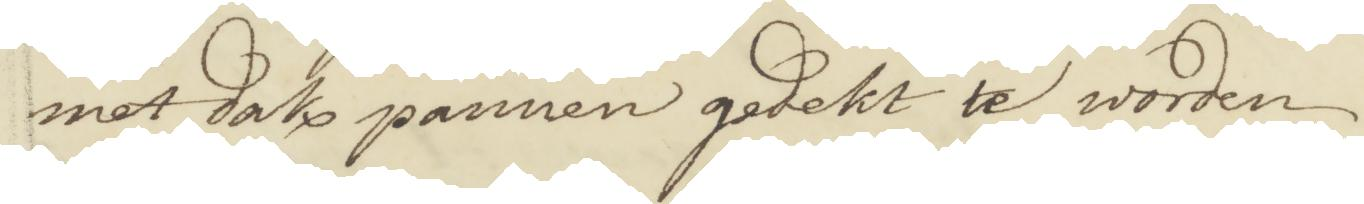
met dak pannen gedekt te worden
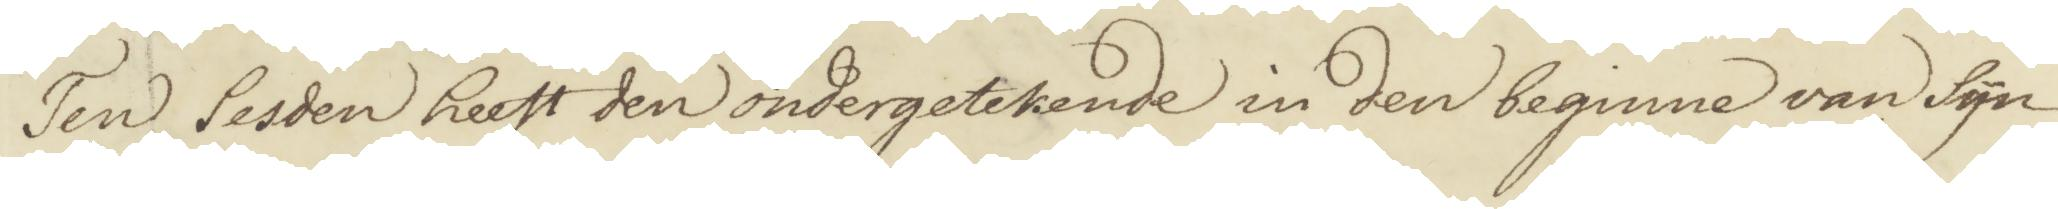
Ten sesden heeft den ondergetekende in den beginne van sijn
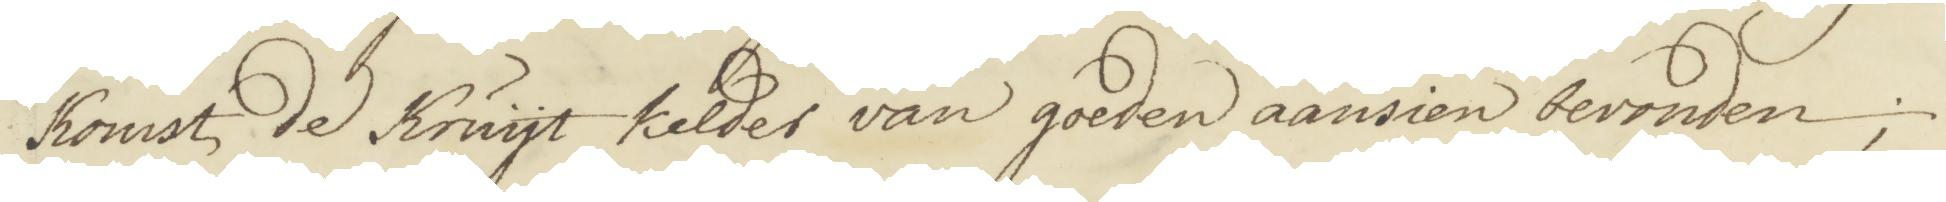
komst de Kruijt kelder van goeden aansien bevonden;
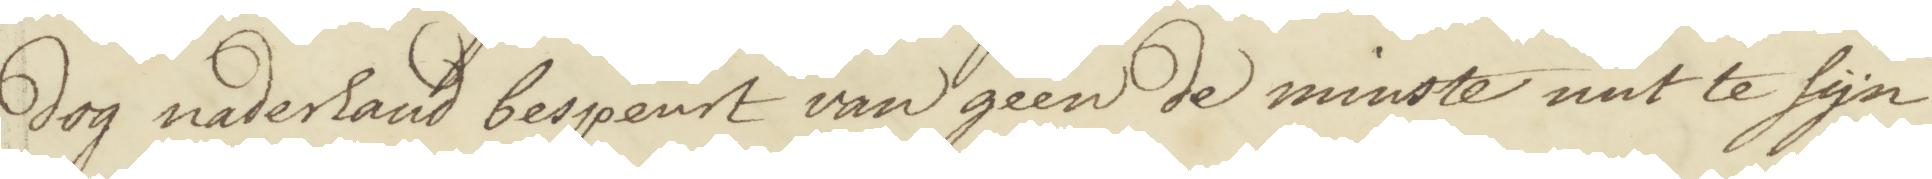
dog naderhand bespeurt van geen de minste nut te sijn
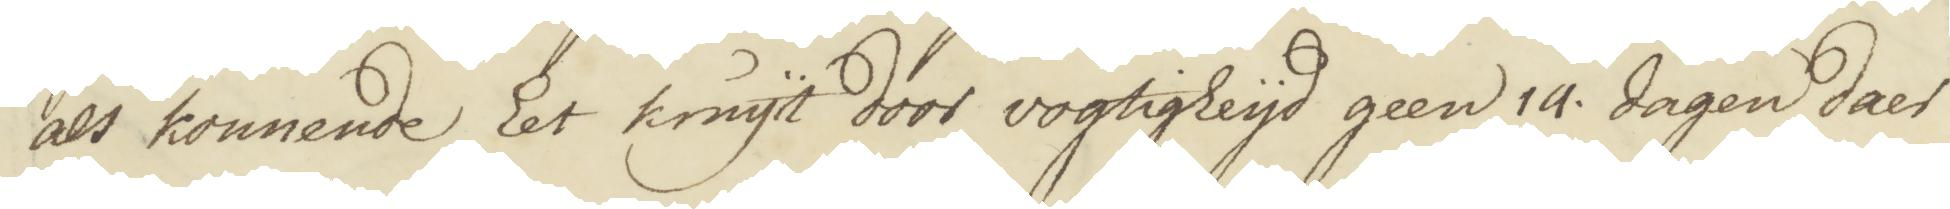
als konnende het kruijt door vogtigheijd geen 14. dagen daer
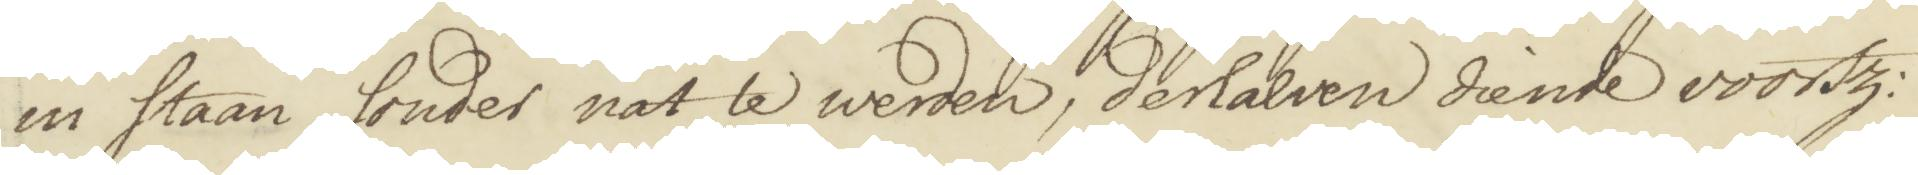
in staan sonder nat te werden, derhalven diende voorsz:
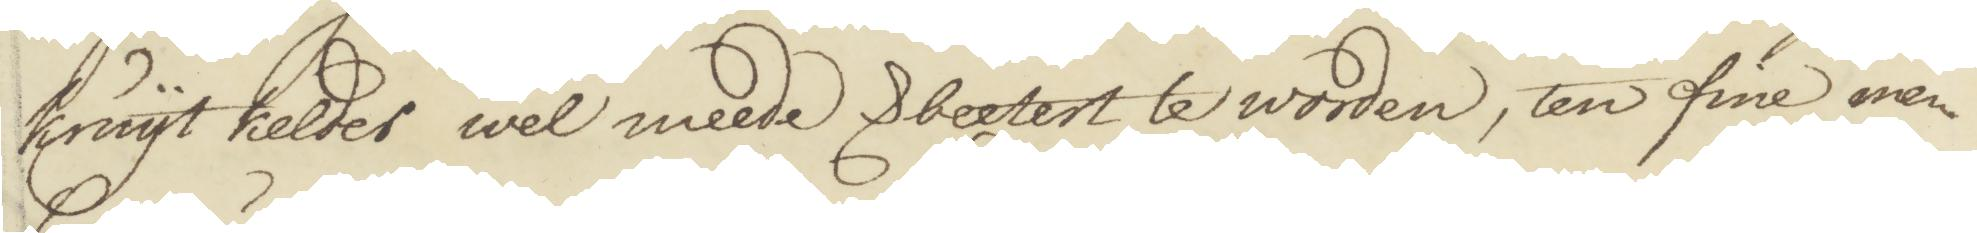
kruijt kelder wel meede verbeetert te worden, ten fine men
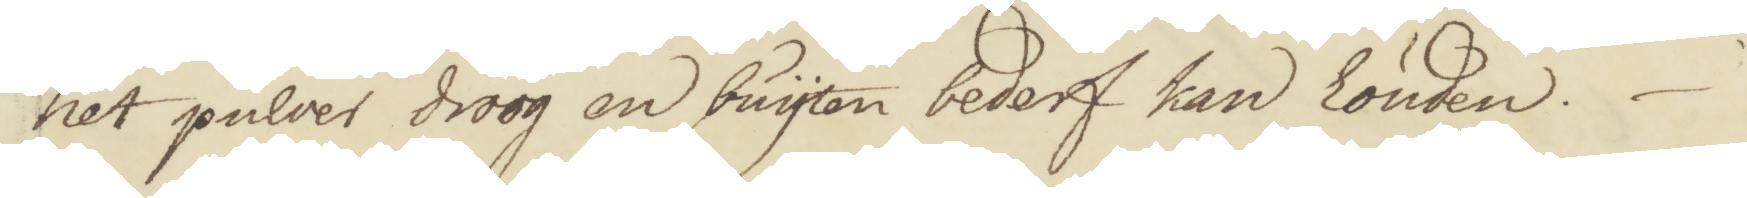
het pulver droog en buijten bederf kan houden. —
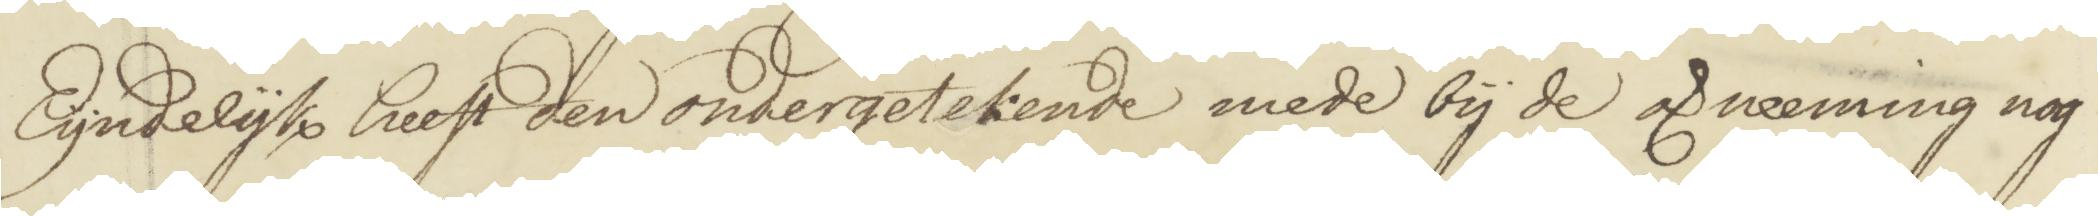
Eijndelijk heeft den ondergetekende mede bij de overneeming nog
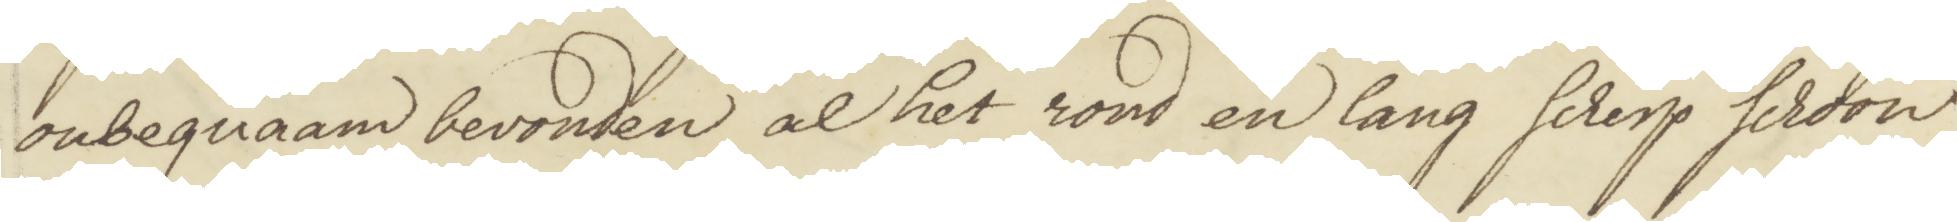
onbequaam bevonden al het rond en lang scherp schoon
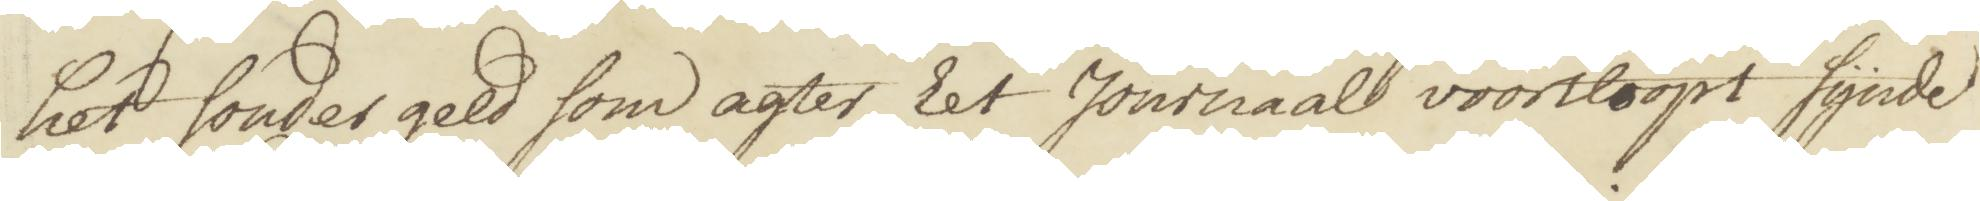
het sonder geld som agter het Journaal voortloopt sijnde
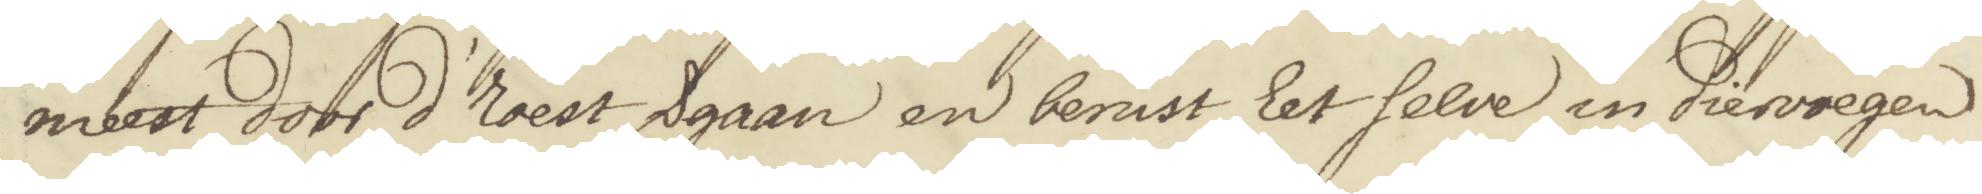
meest door d’ roest vergaan en berust het selve in diervoegen
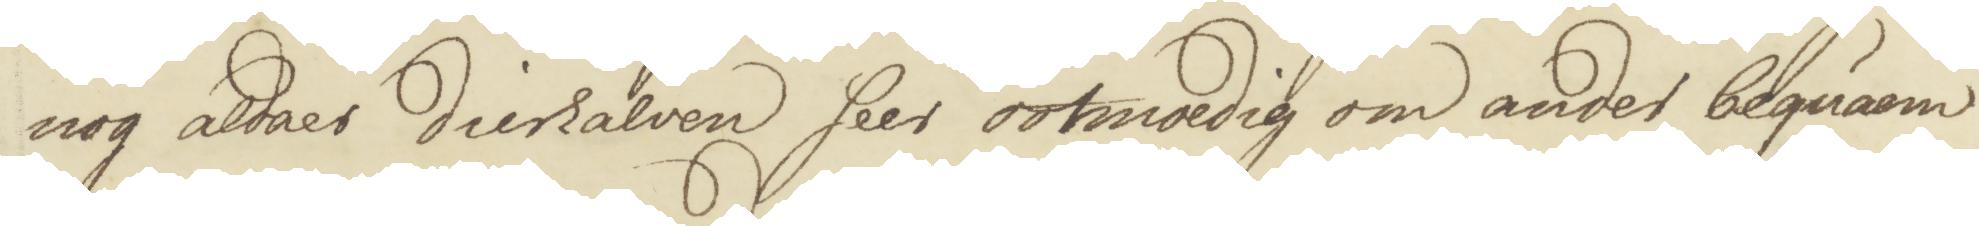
nog aldaer dierhalven seer ootmoedig om ander bequaam
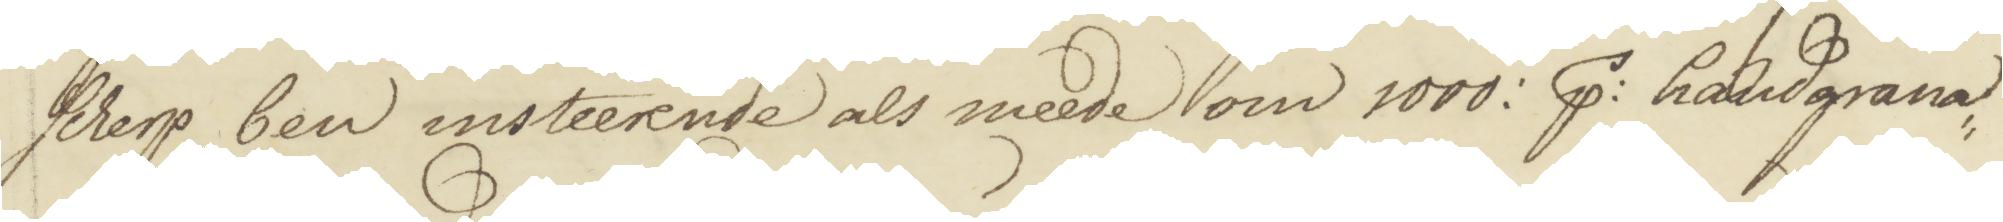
scherp ben insteerende als meede om 1000: p:s handgrana„
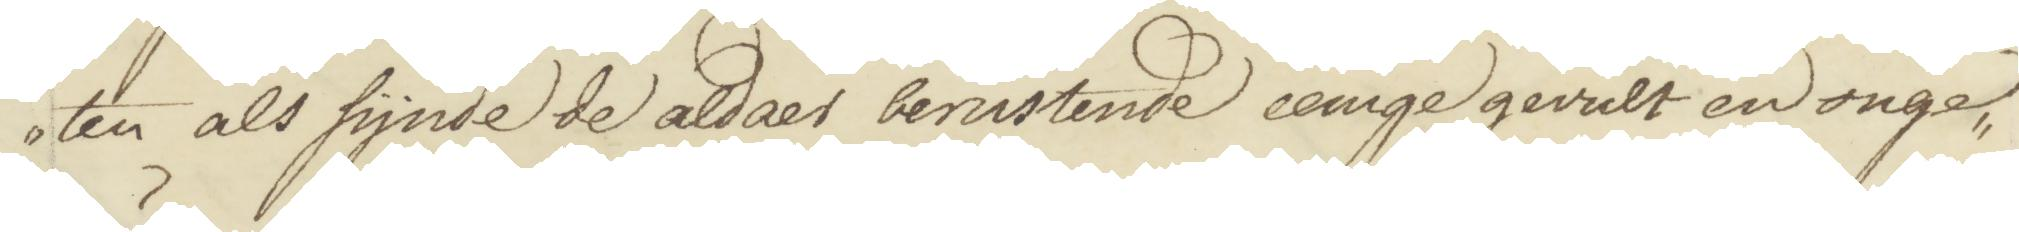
„ten als sijnde de aldaer berustende eenige gevult en onge„
